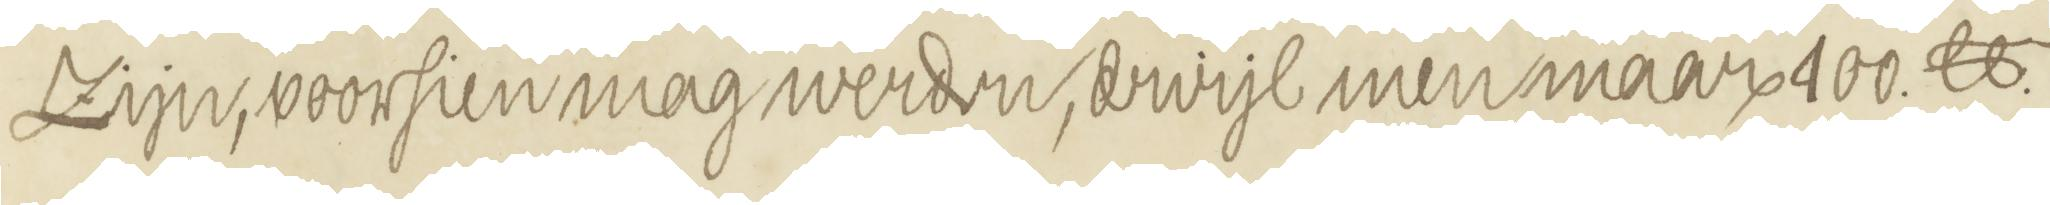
zijn, voorsien mag werden, dewijl men maar 400. lb.
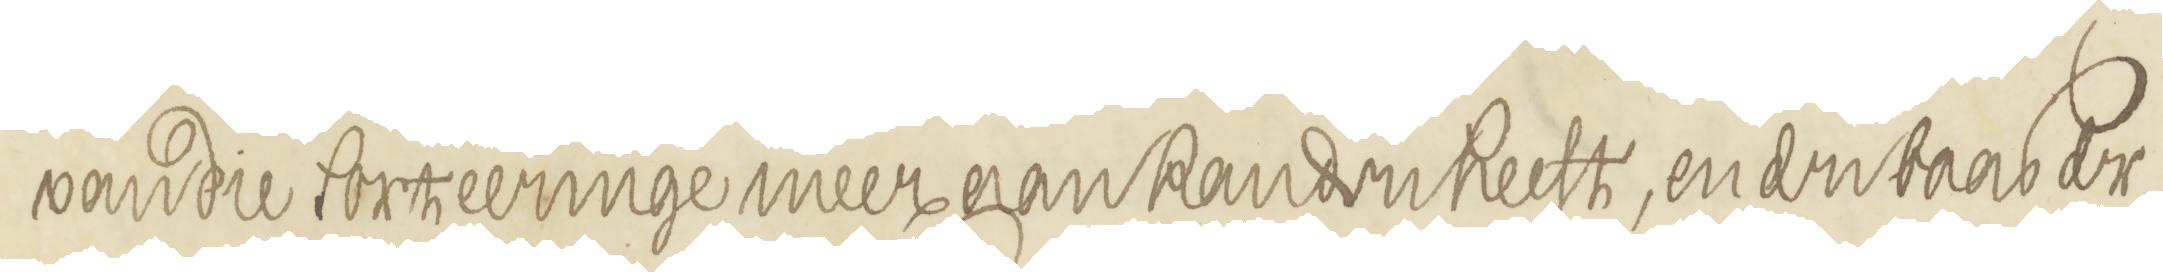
van die sorteeringe meer aan handen heeft, en den baas der
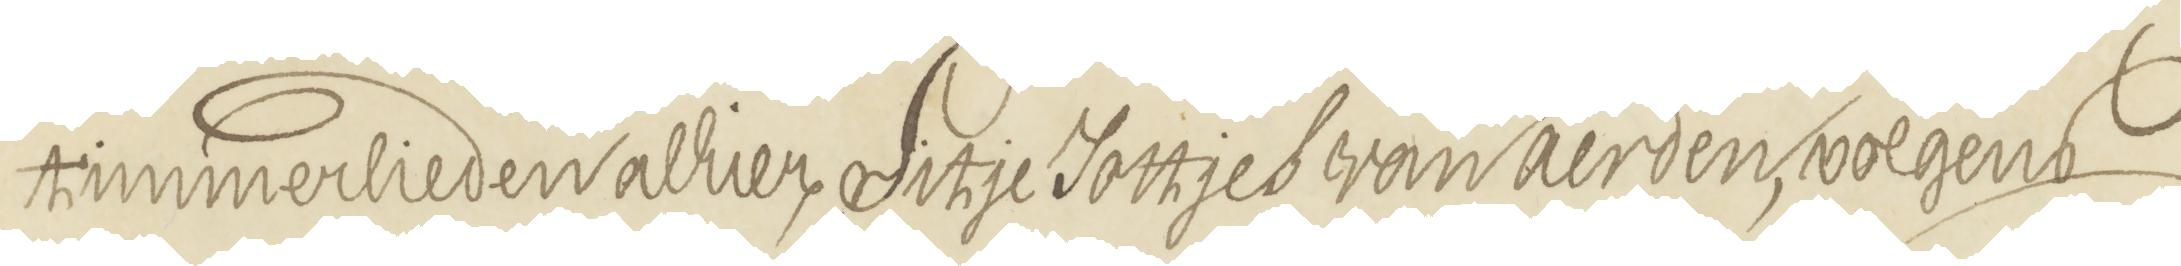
timmerlieden alhier Sitje Jottjes van aerden, volgens
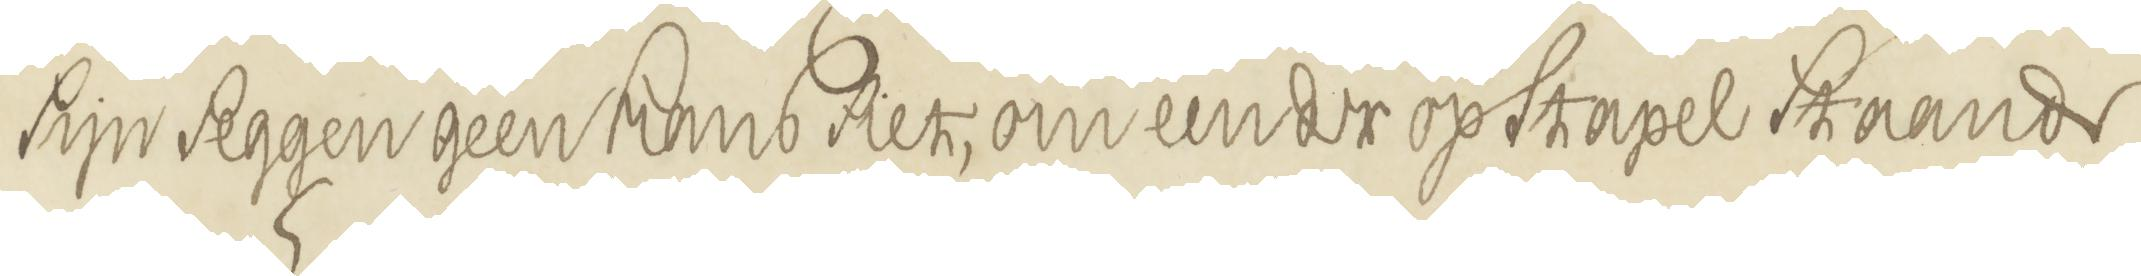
sijn seggen geen kans siet, om een der op stapel staande
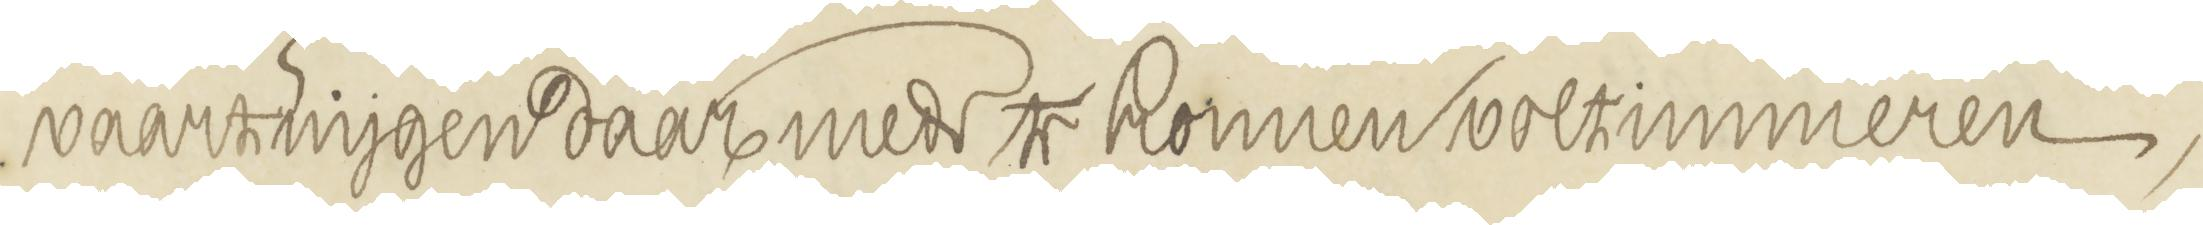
vaartuijgen daar mede te konnen voltimmeren,
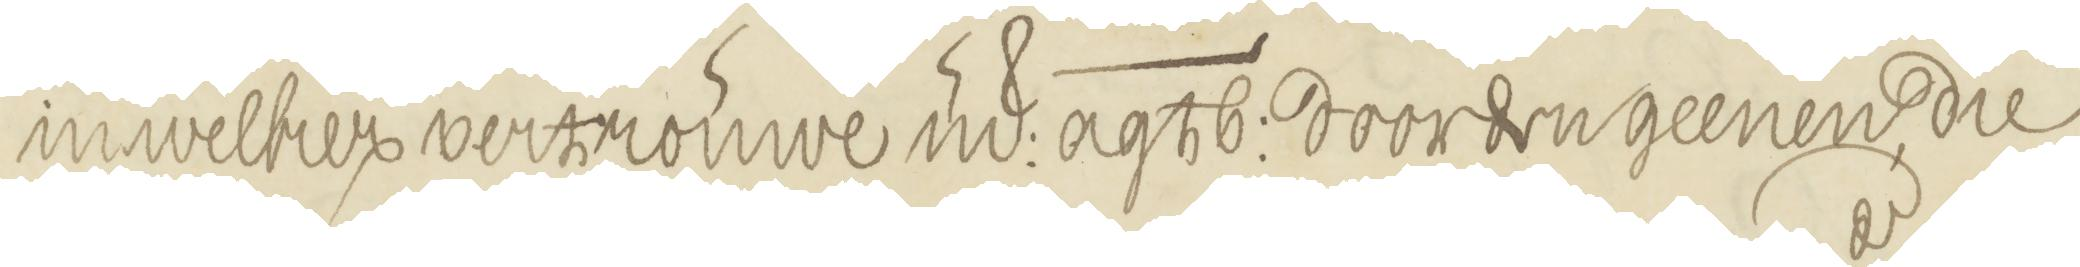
in welker vertrouwe uE: agtb: door den geenen, die
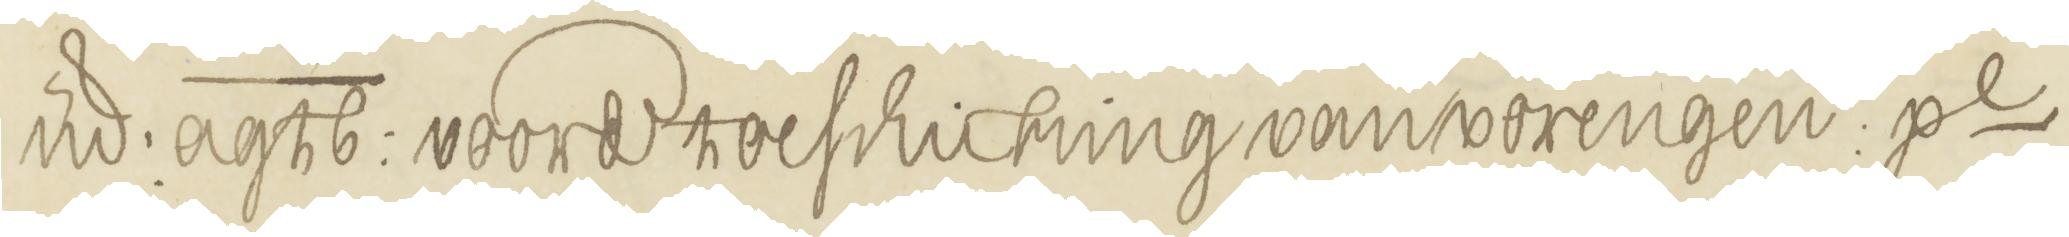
uE: agtb: voor de toeschicking van voren gen:de p_l
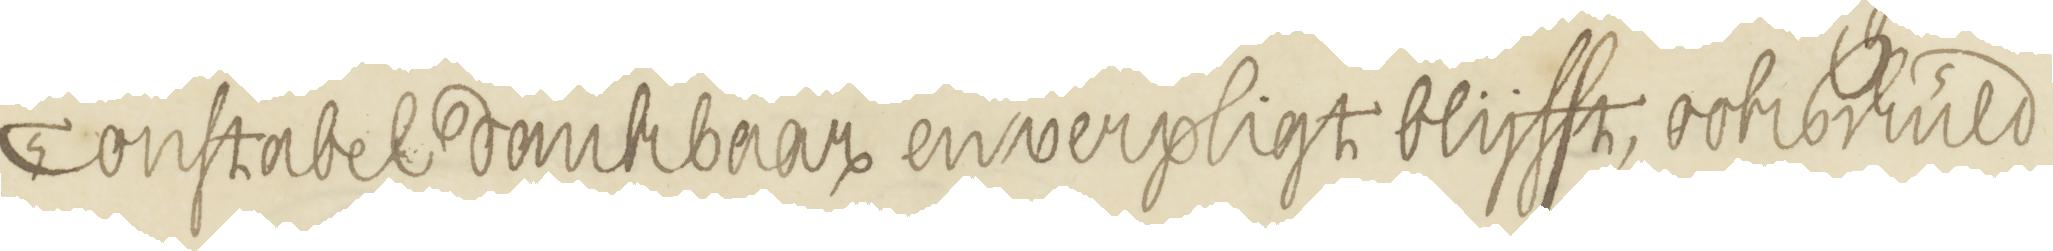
constabel dankbaar en verpligt blijfft, ook schuld
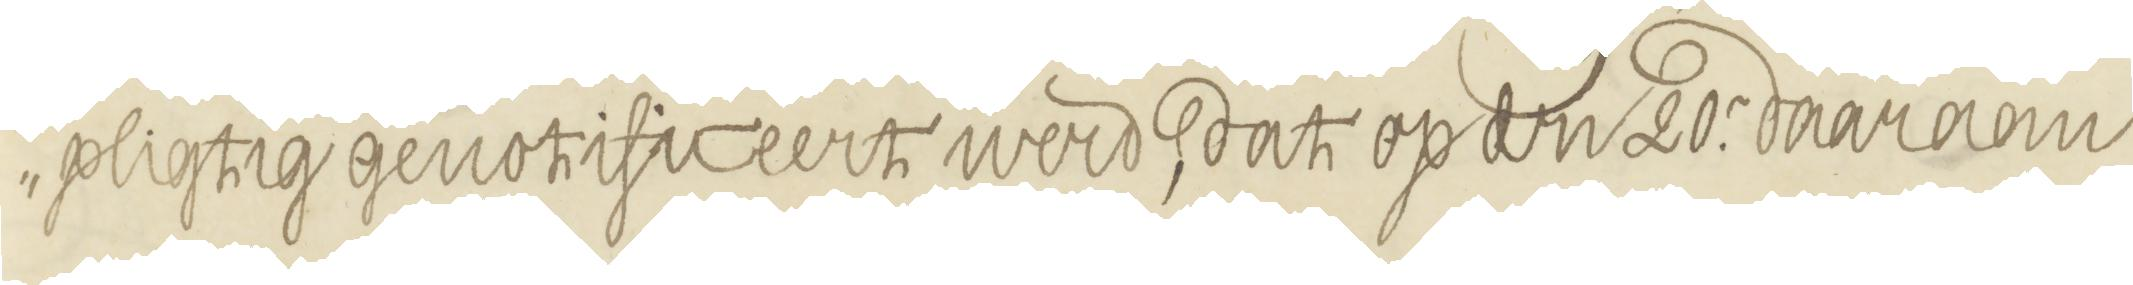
„pligtig genotificeert werd, dat op den 20.' daar aan
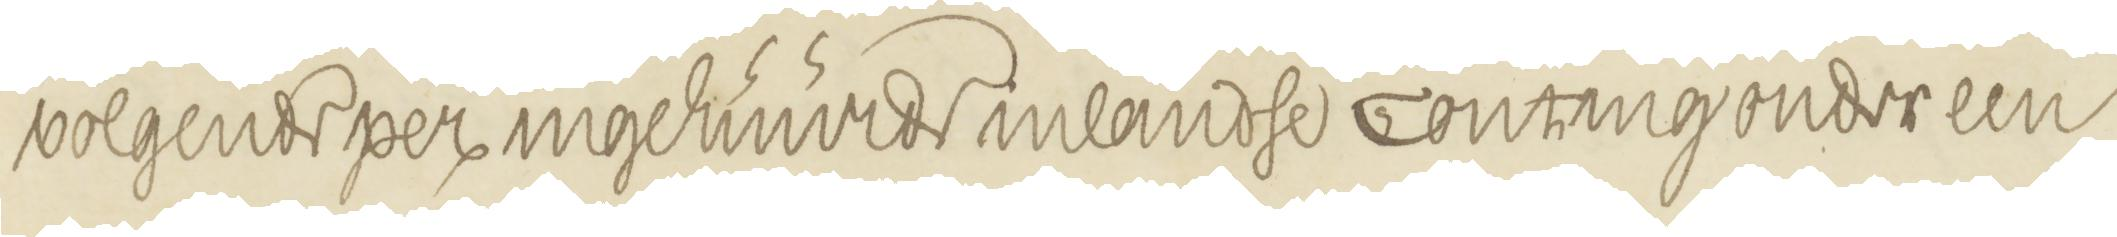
volgende per ingehuurde inlandse conting onder een
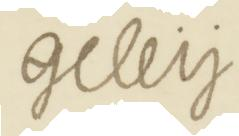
geleij
